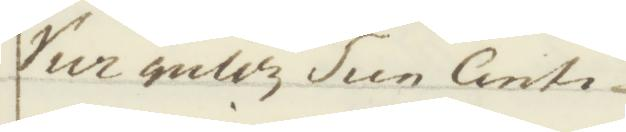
Vier gulden Tien Cents
